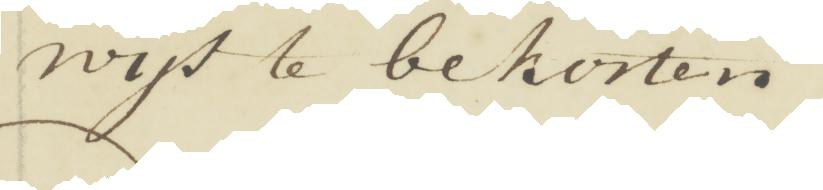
wijs te bekorten
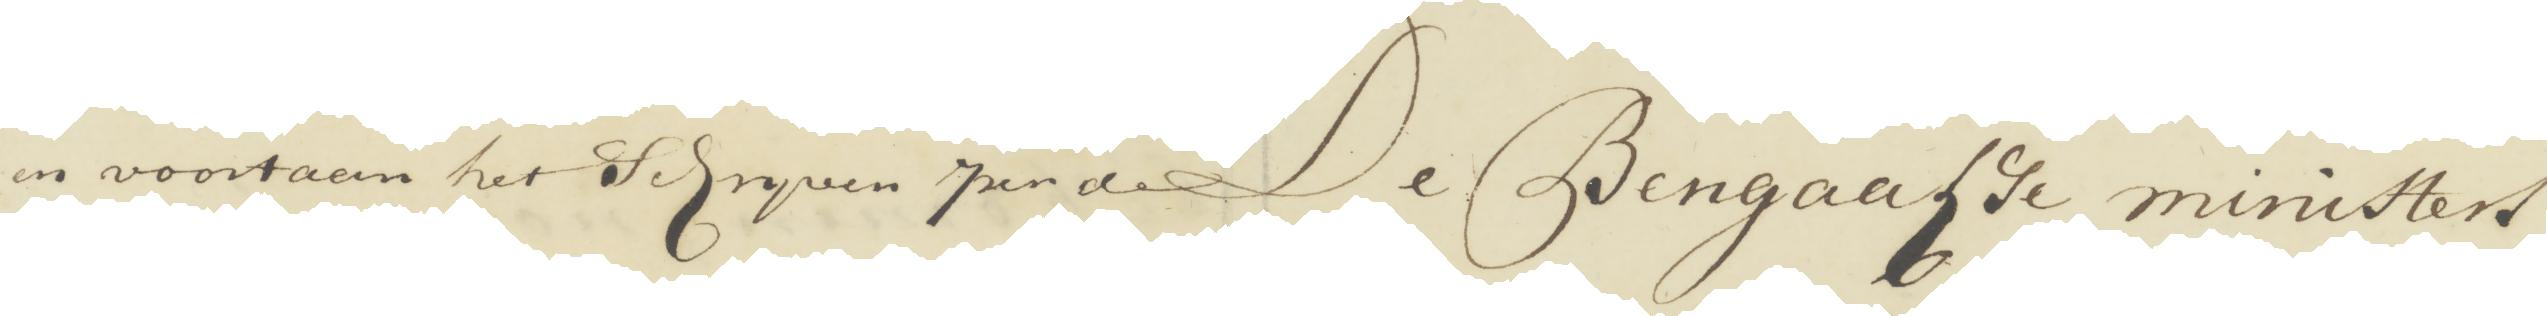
in voortaan het schrijven per de De Bengaalse ministers
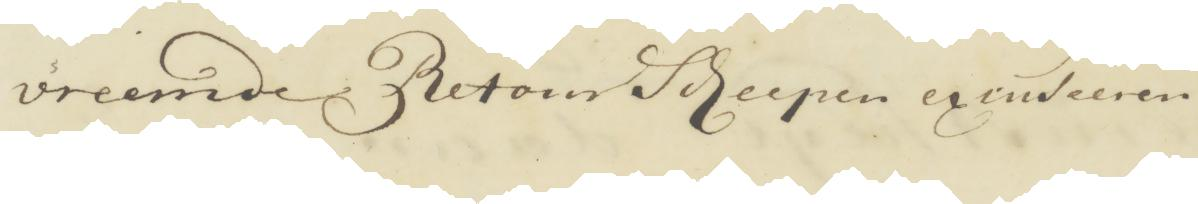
vreemde Retour scheepen excuseeren
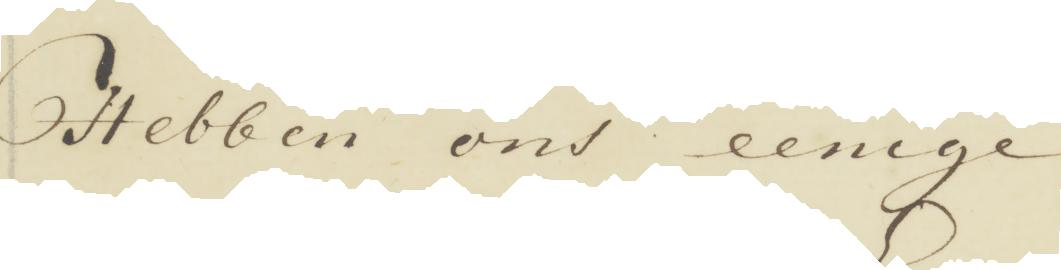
Hebben ons eenige
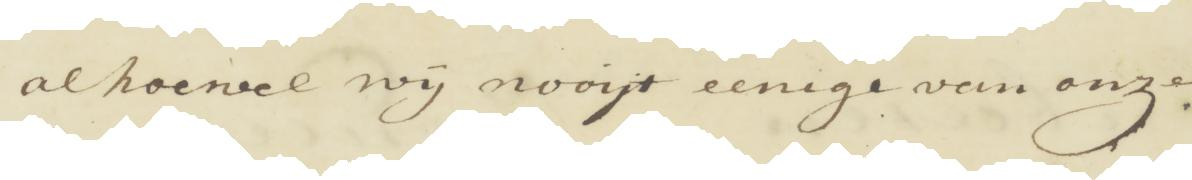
alhoewel wij nooijt eenige van onz
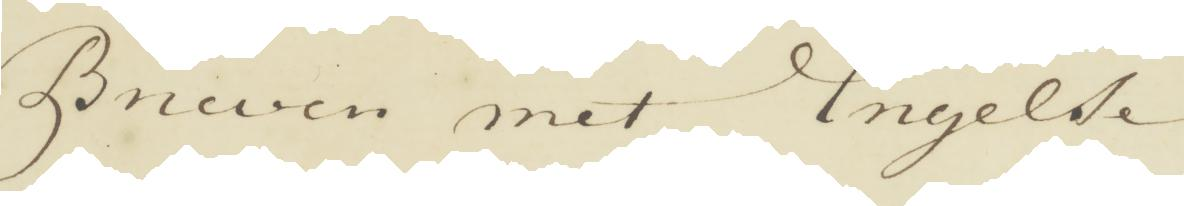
Brieven met Engelse
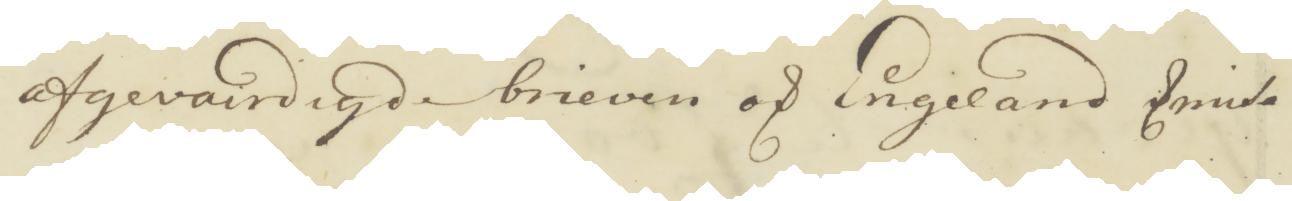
afgevairdigde brieven over Engeland vermise
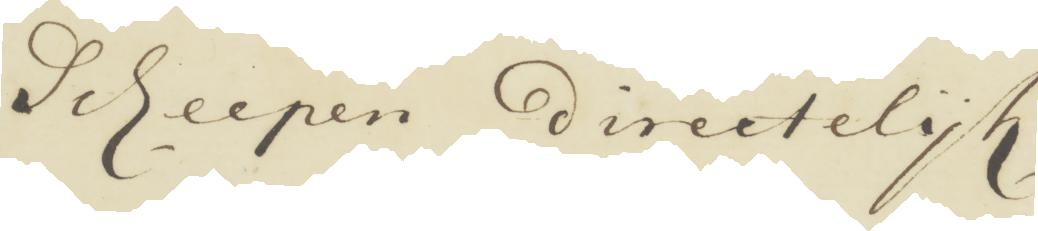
scheepen directelijk
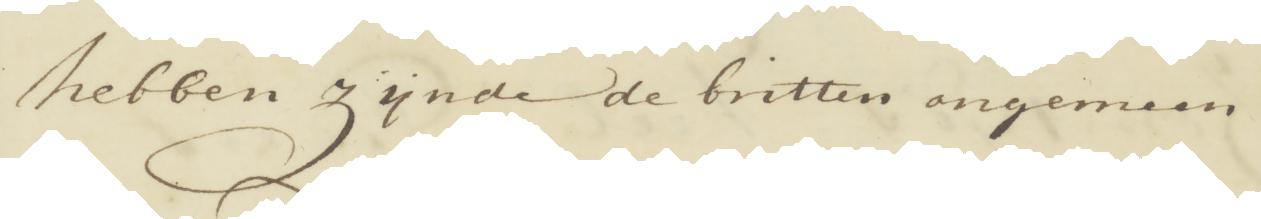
hebben zijnde de britten ongemeen
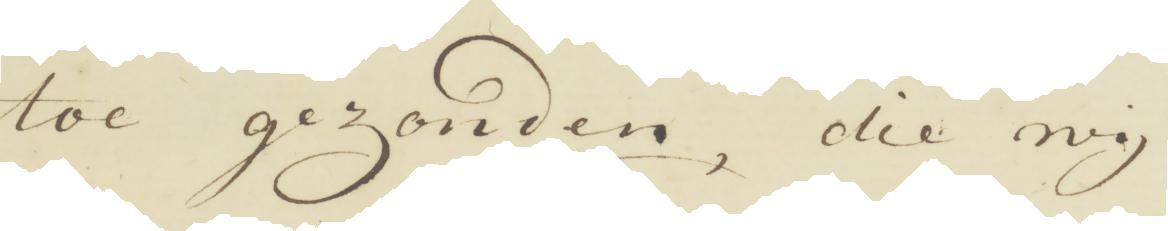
toe gezonden, die wij
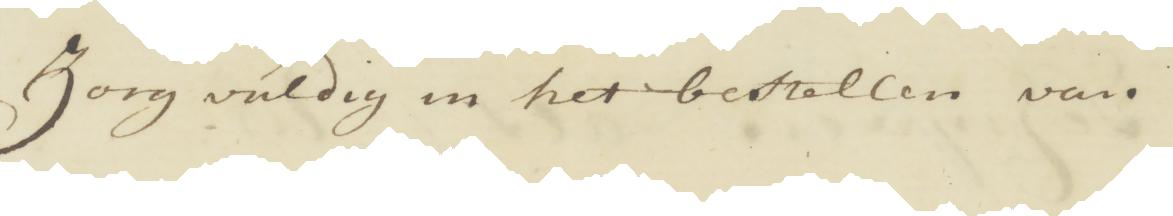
Zorg vuldig in het bestellen van
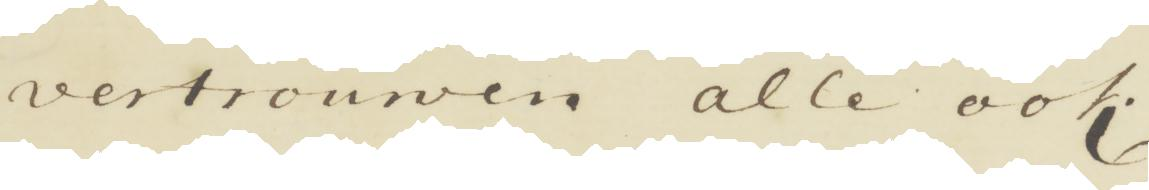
vertrouwen alle ook
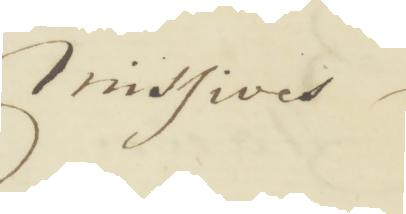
missives
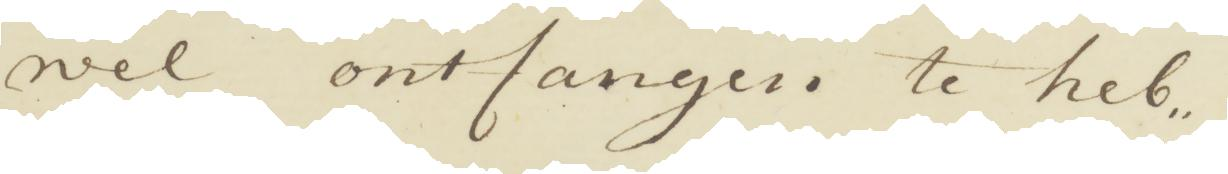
wel ontfangen te heb„
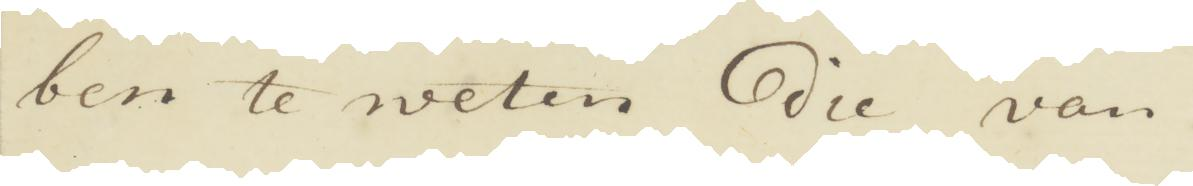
ben te weten die van
